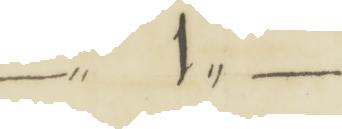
—„ 1„ —
